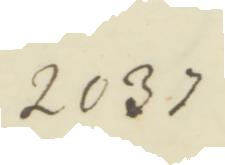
2037
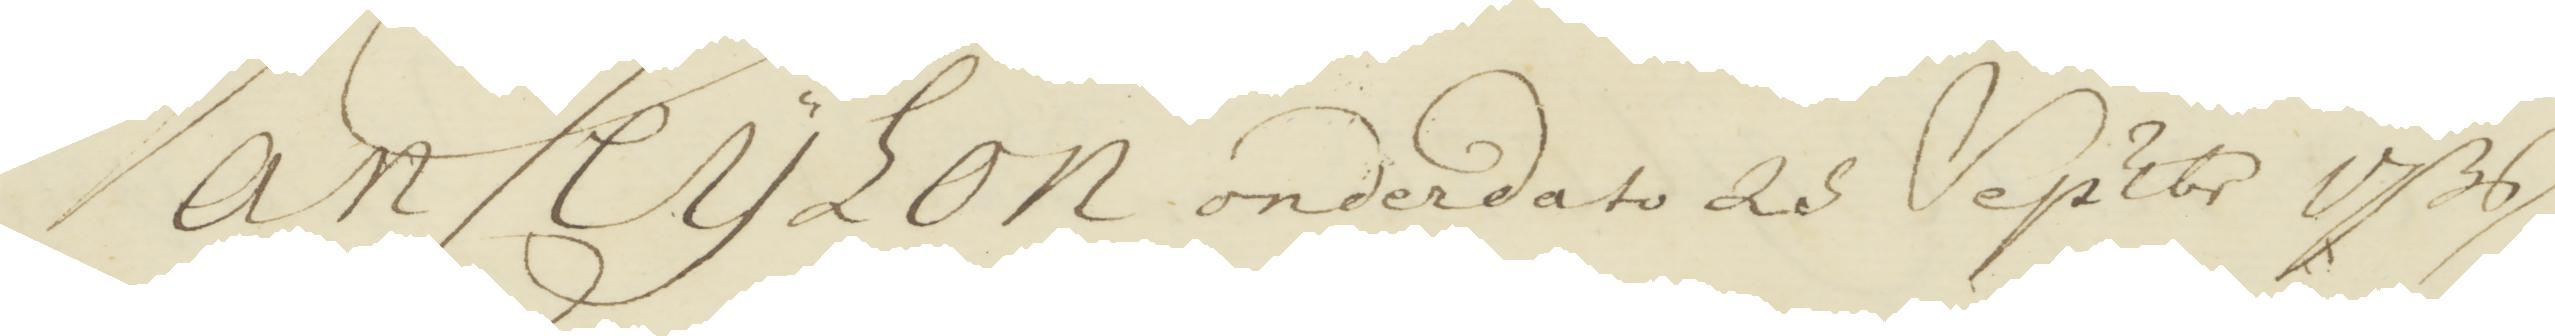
Van Ceijlon onderdato 25 Septbr 1736
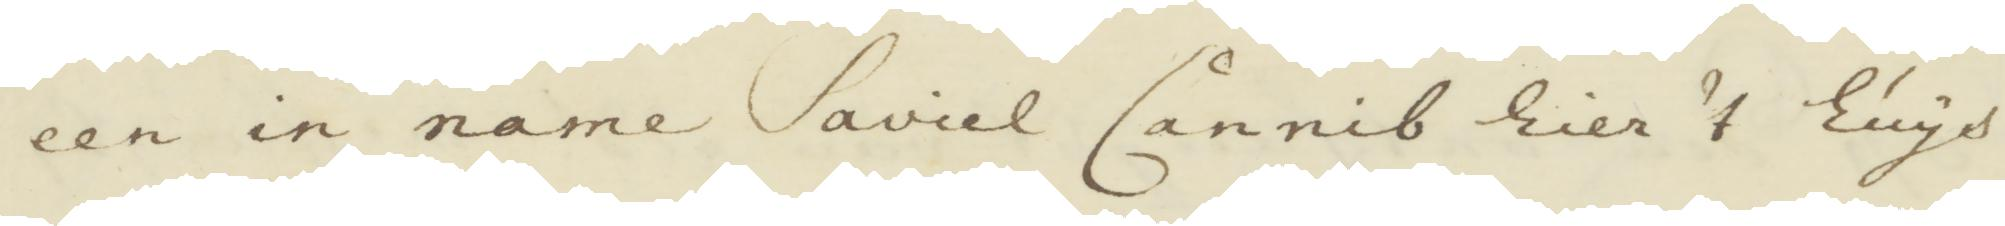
een in name Saviel Cannib hier ’t huijs
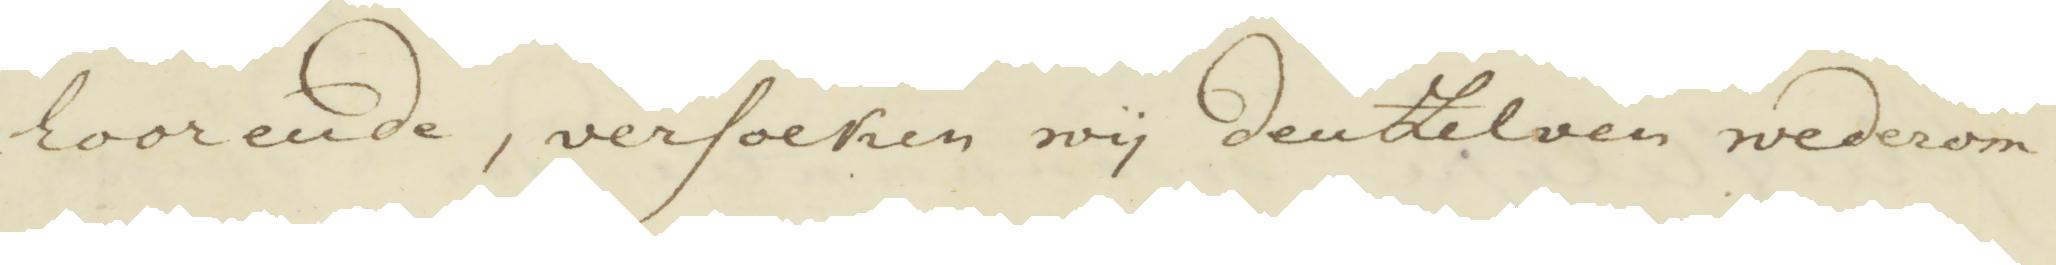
hoorende, versoeken wij denzelven wederom
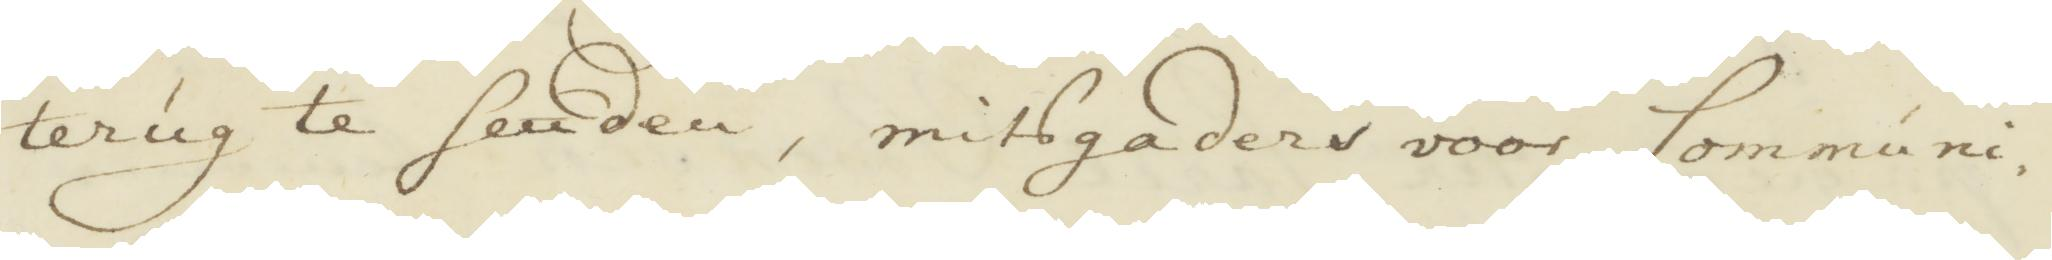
terug te senden, mitsgaders voor Communi„
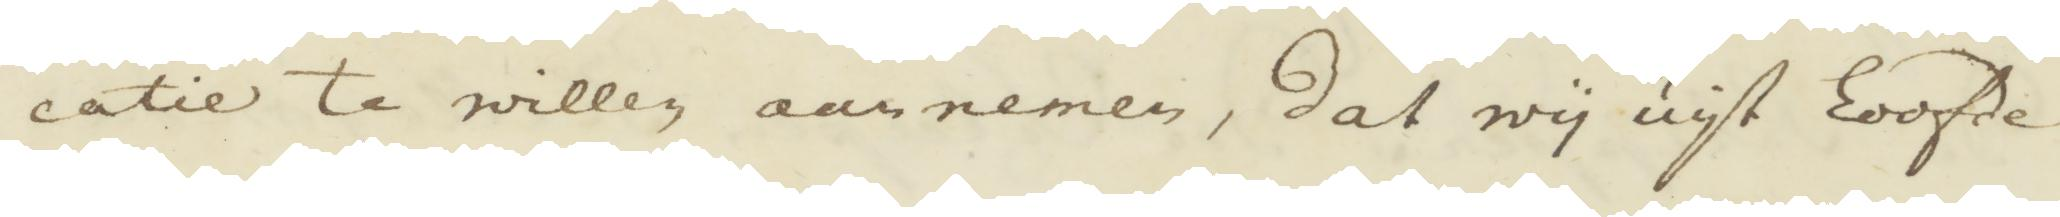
catie te willen aannemen, dat wij uijt hoofde
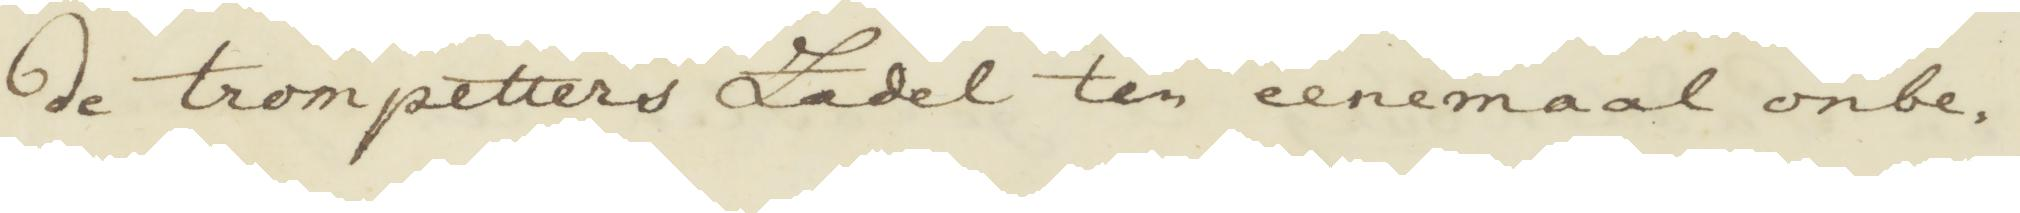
de trompetters Zadel ten eenemaal onbe„
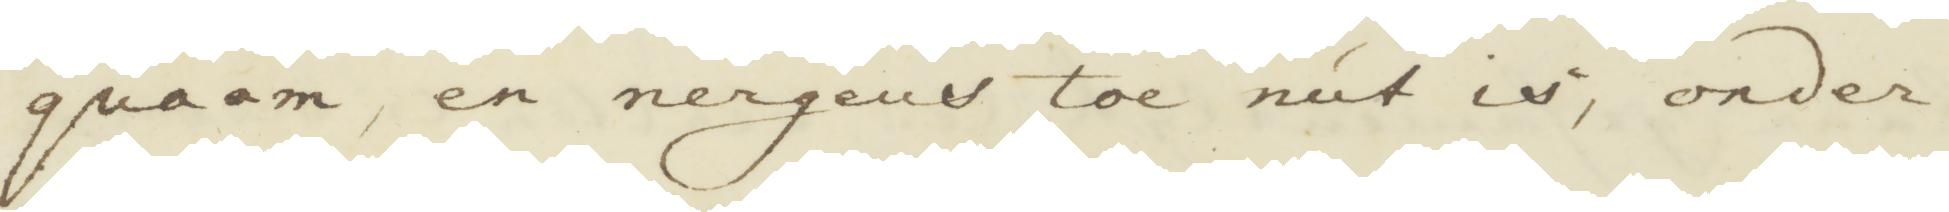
quaam, en nergens toe nut is, onder
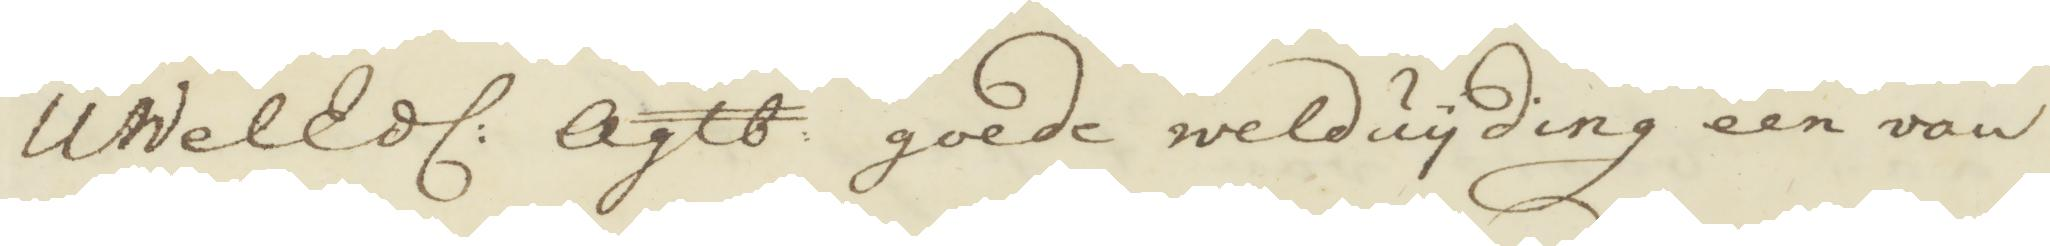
UwelEd: Agtb: goede welduijding een van
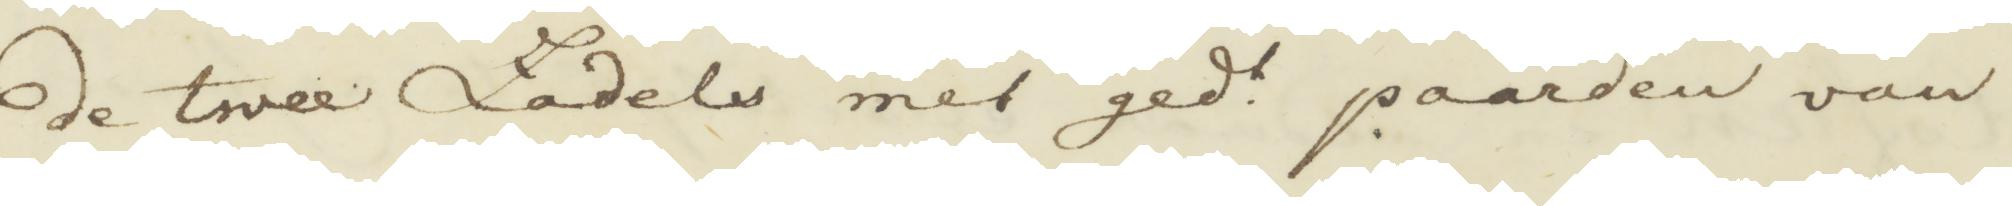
de twee Zadels met ged.t paarden van
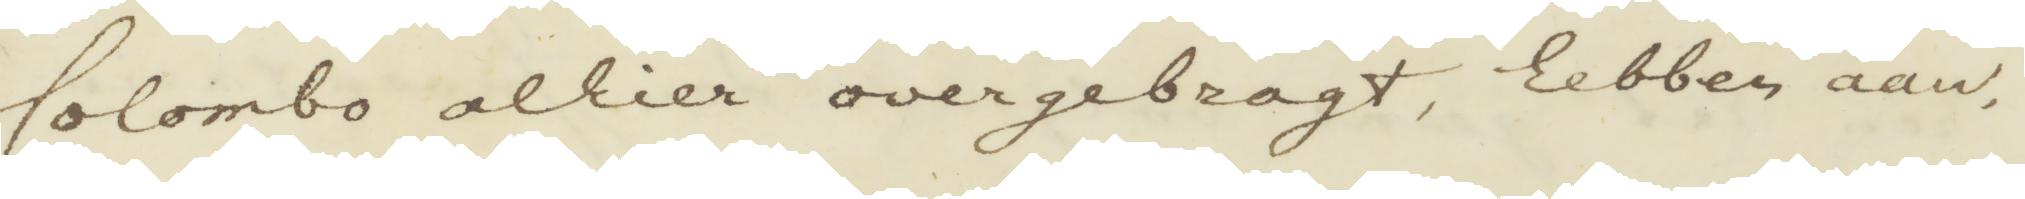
Colombo alhier overgebragt, hebben aan„
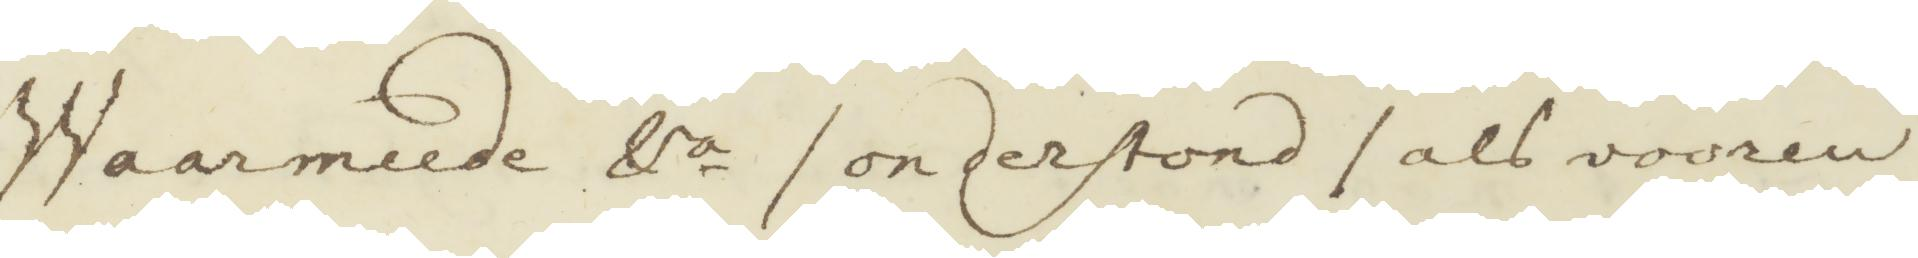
Waarmeede &-a /onderstond/ als vooren
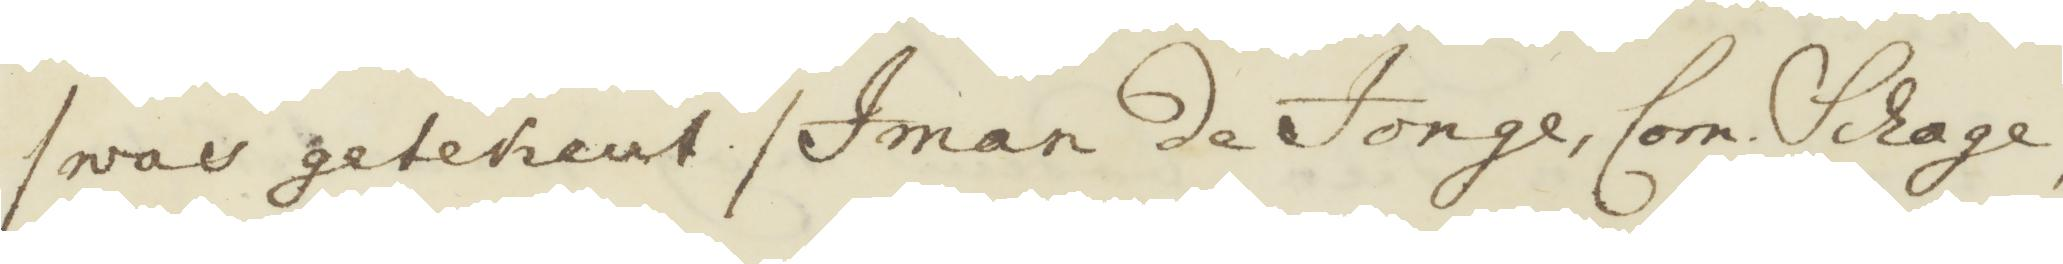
/was getekent/ Iman de Ionge, Corn. Schage,
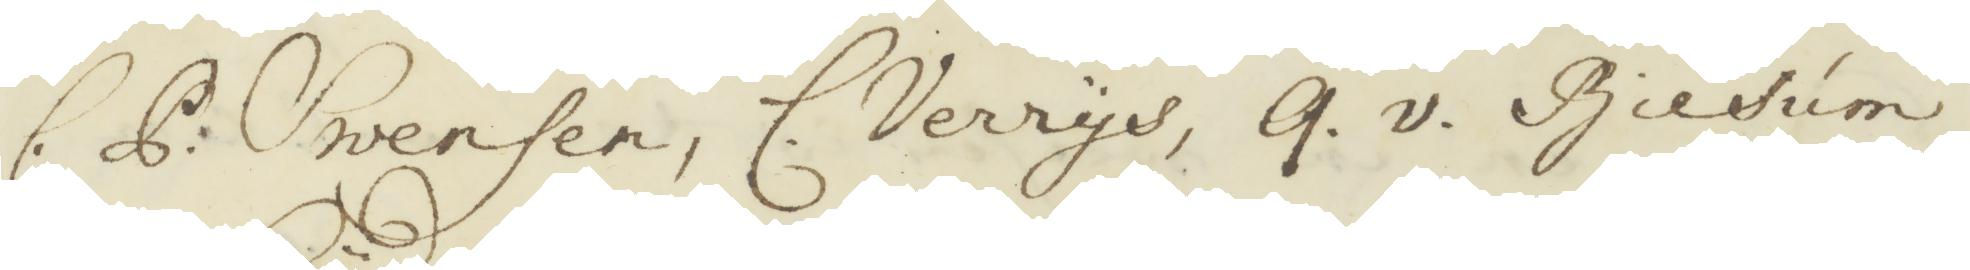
C. P: Swensen, C. Verrijs, Q. v. Biesum
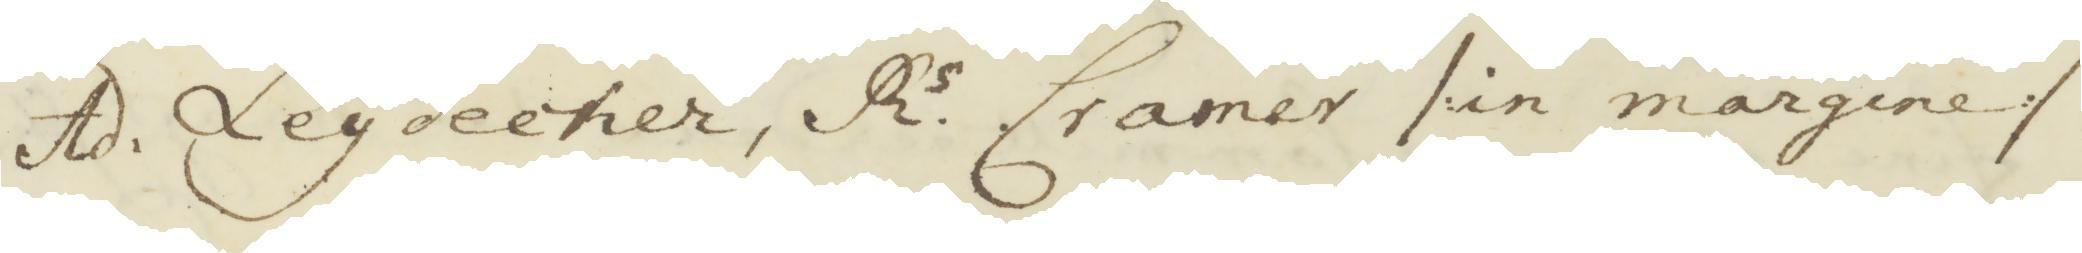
Ad. Leijdecker, R=s Cramer /:in margine:/
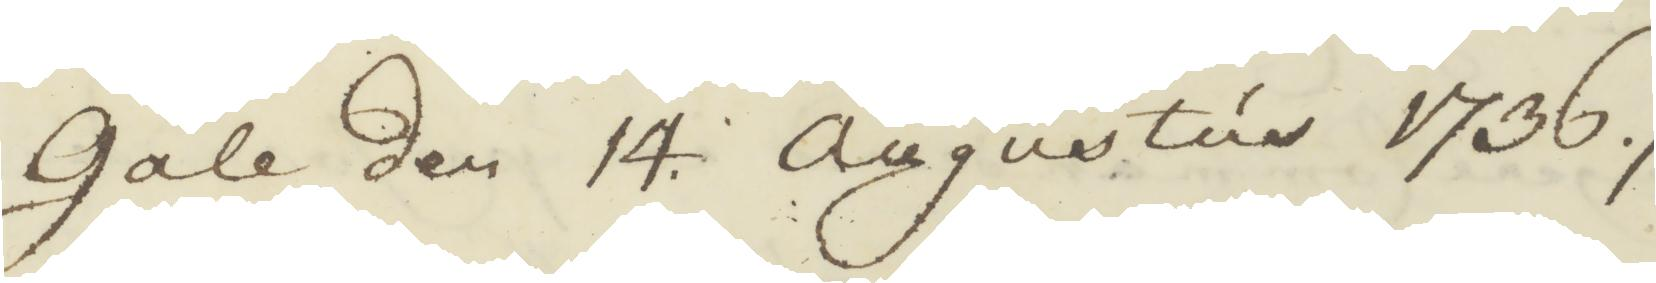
Gale den 14. Augustus 1736./
